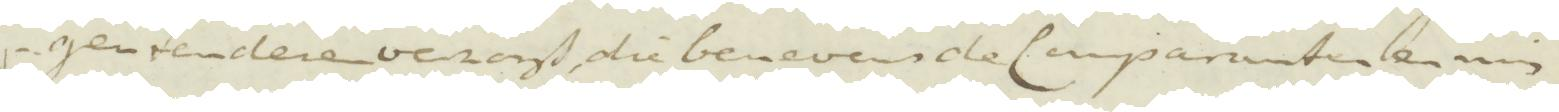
„gen ten deze verzogd, die benevens de Comparanten en mij
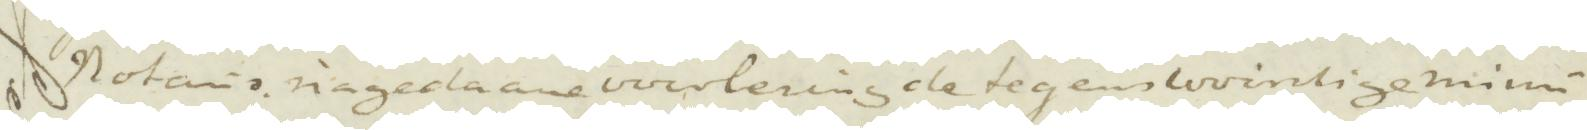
Notaris na gedaane voorlezing de tegenswoordige minu
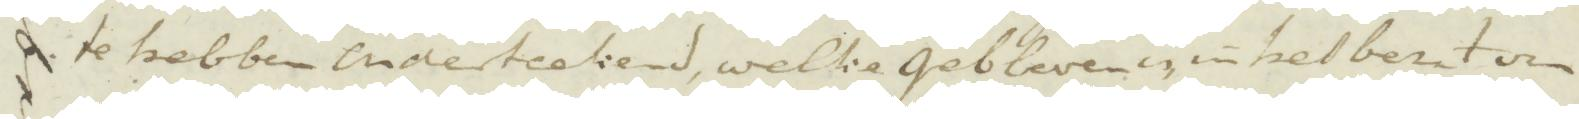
te hebben onderteekend, welke gebleven is, in het bezit van
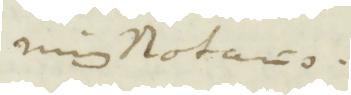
mij Notaris
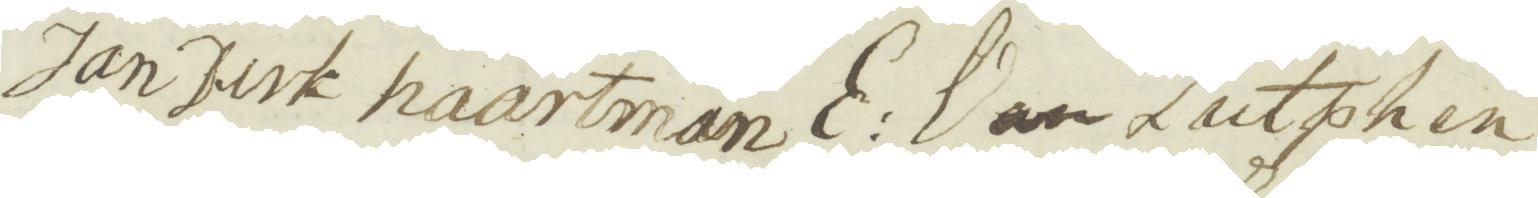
Jan Dirk haartman E: Van Zutphen
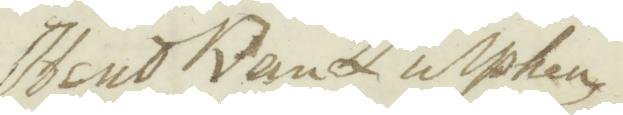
Hendr van Zutphen
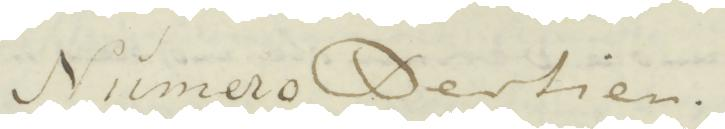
Numero Dertien.
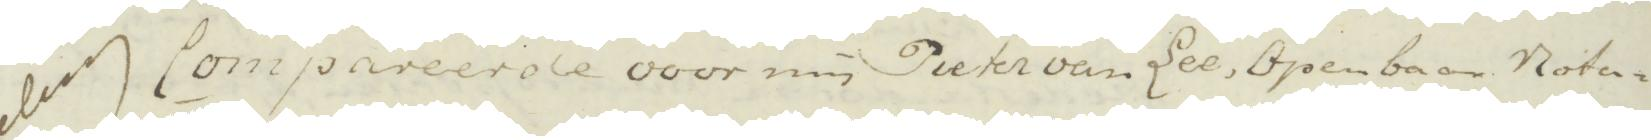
Compareerde voor mij Pieter van Lee, Openbaar Nota
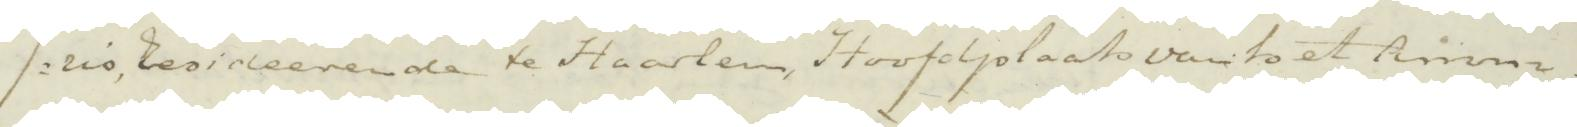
„ris, Resideerende te Haarlem, Hoofdplaats van het Arron„
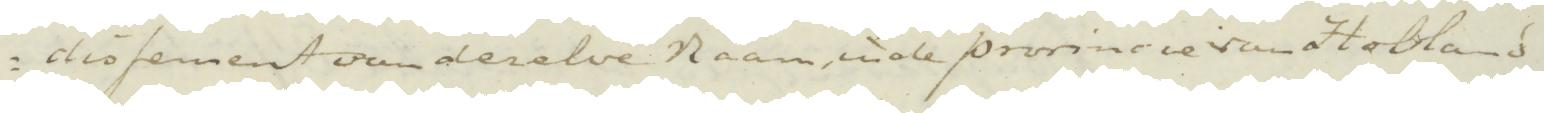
„dissement van dezelve Naam, in de provincie van Holland
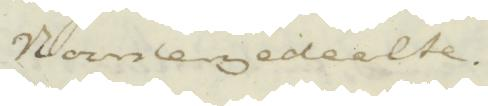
Voorsten gedeelte.
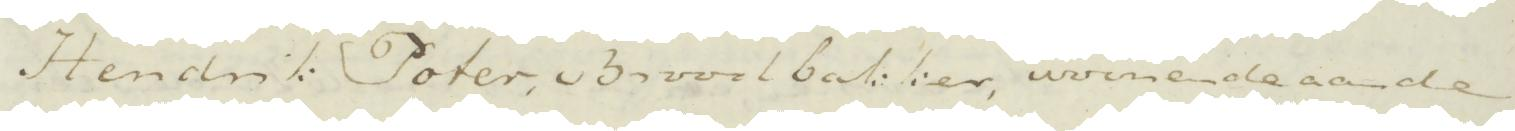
Hendrik Poter, Broodbakker, woonende aan de
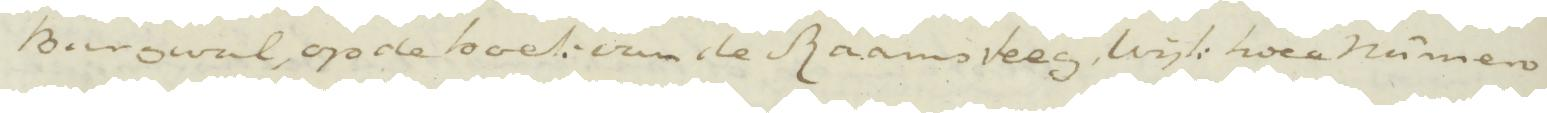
Burgwal, op de hoek van de Raamsteeg, Wijk twee Numero
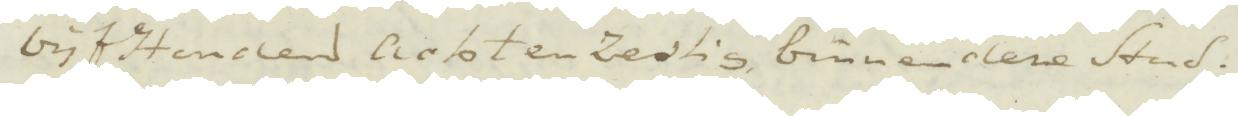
vijf Honderd Acht en zestig, binnen deze stad.
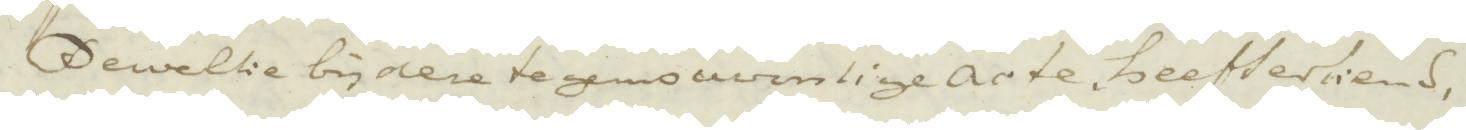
Dewelke bij deze tegenswoordige Acte, heeft erkend,
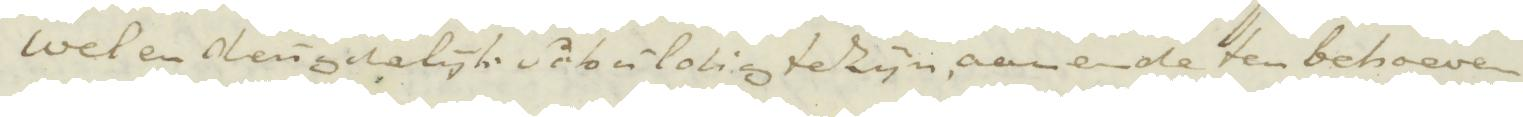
wel en deugdelijk schuldig te zijn, aan ende ten behoeven
